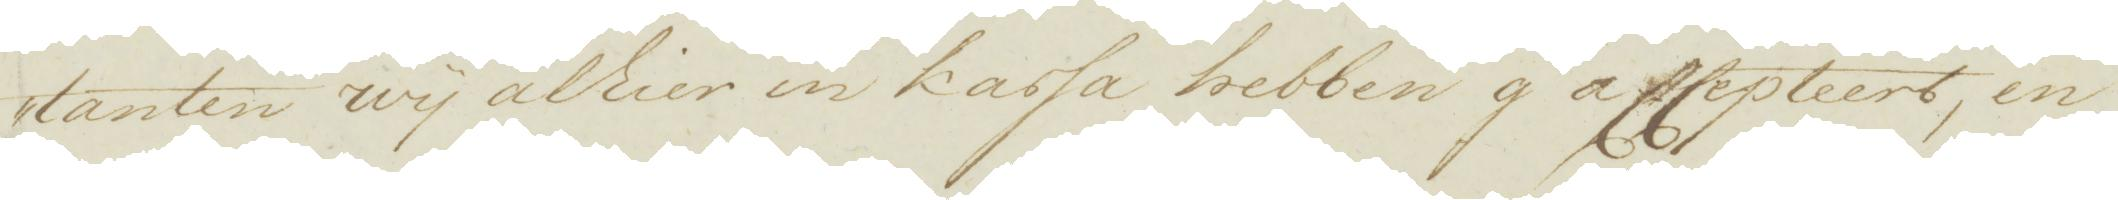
tanten wij alhier in kassa hebben g’accepteert, en
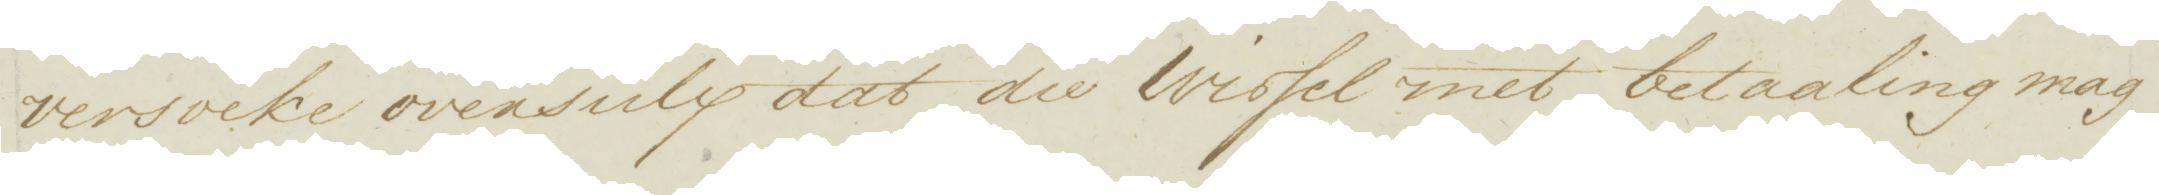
versoeke oversulx dat die wissel met betaaling mag
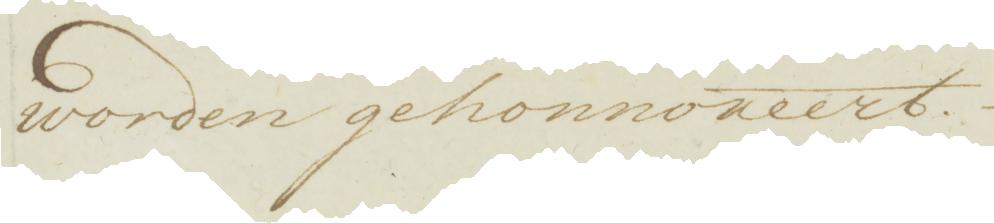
worden gehonnoreert.
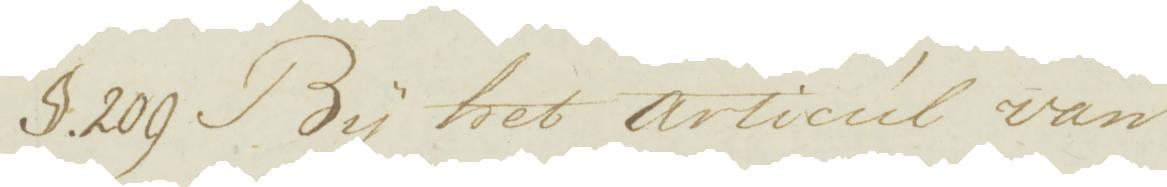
§. 209 Bij het articul van
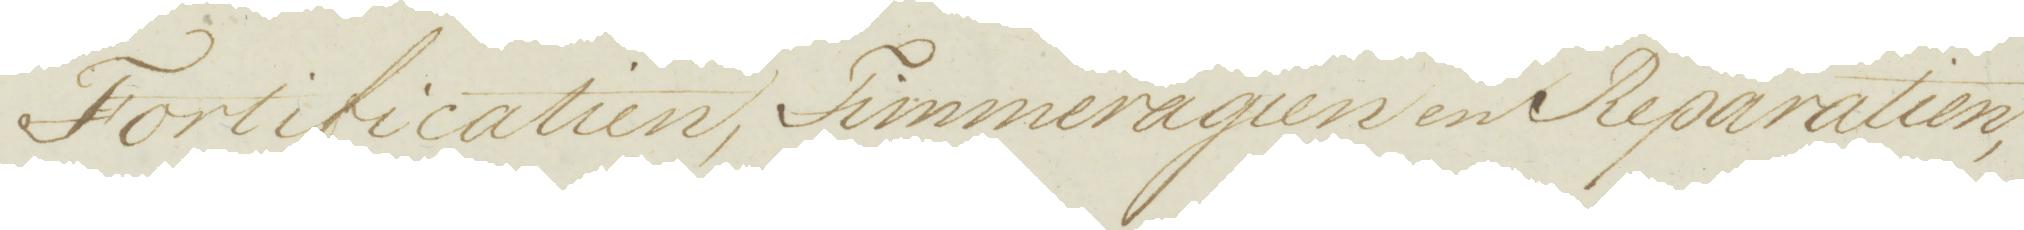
Fortificatien, Timmeragien en Reparatien,
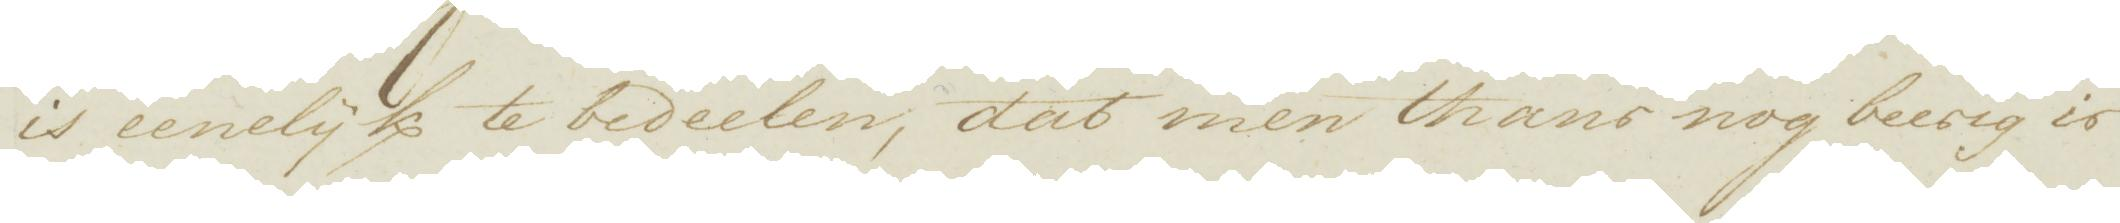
is eenelijk te bedeelen, dat men thans nog beesig is
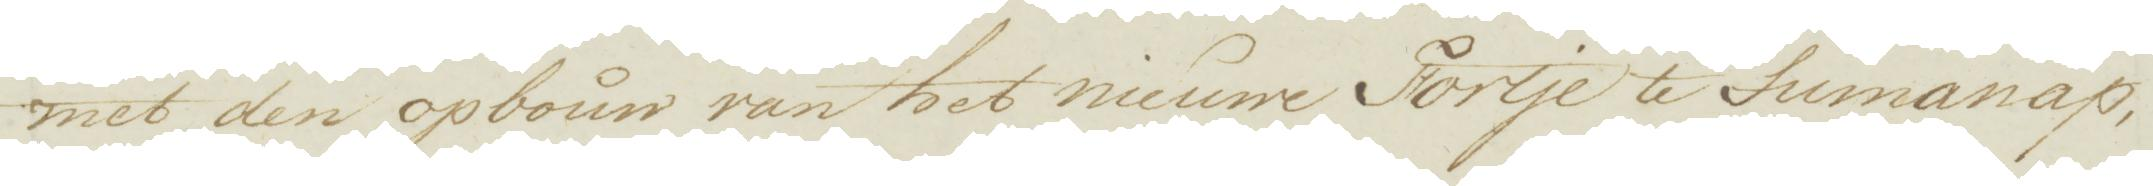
met den opbouw van het nieuwe Fortje te Sumanap,
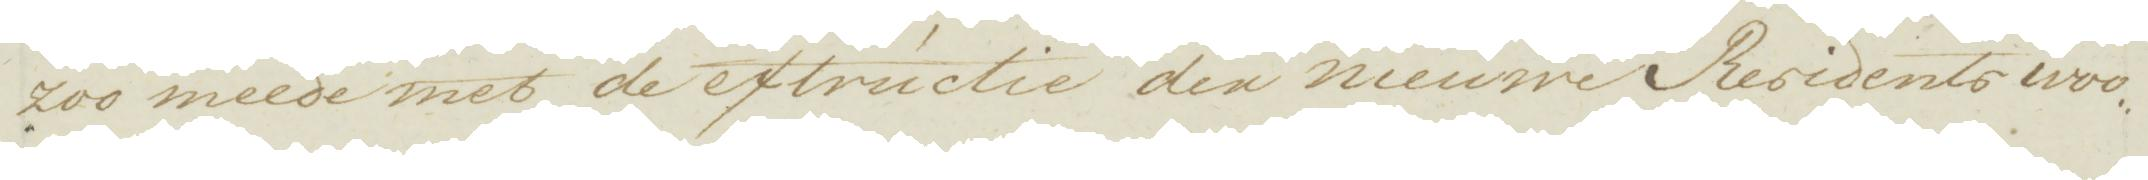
zoo meede met de extructie der nieuwe Residents woo„
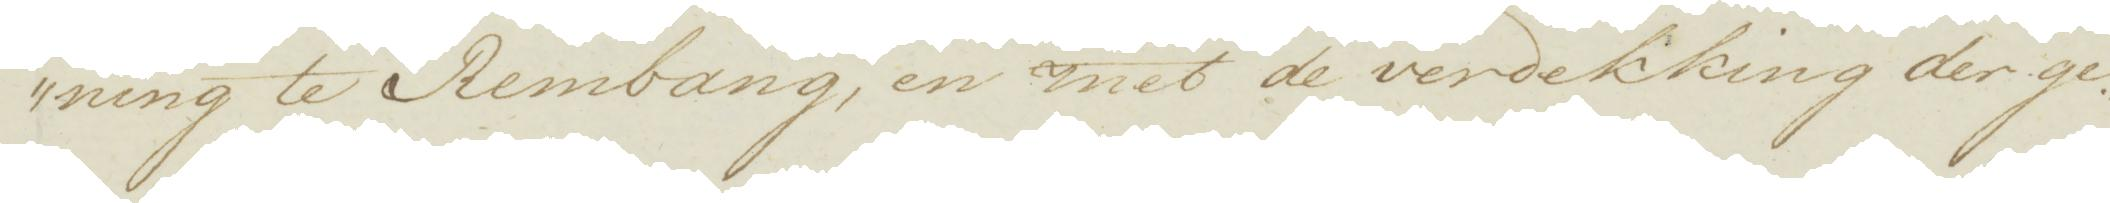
„ning te Rembang, en met de verdekking der ge
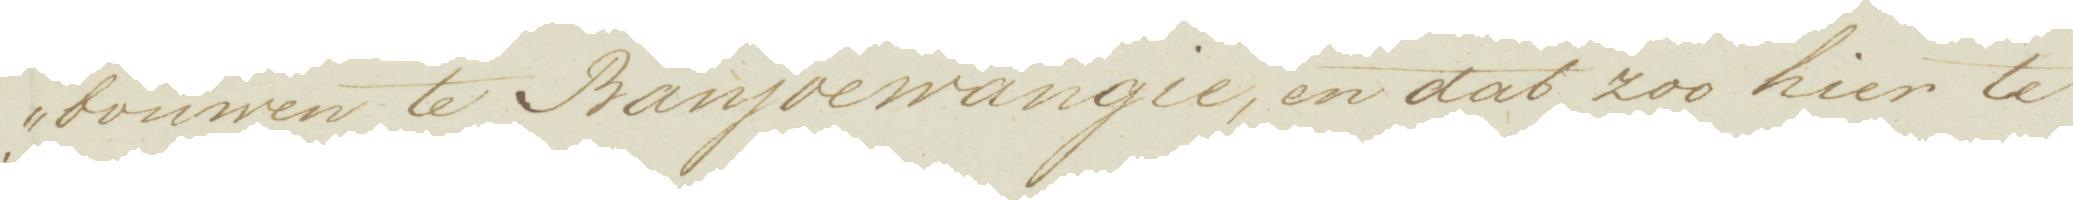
„bouwen te Banjoewangie, en dat zoo hier te
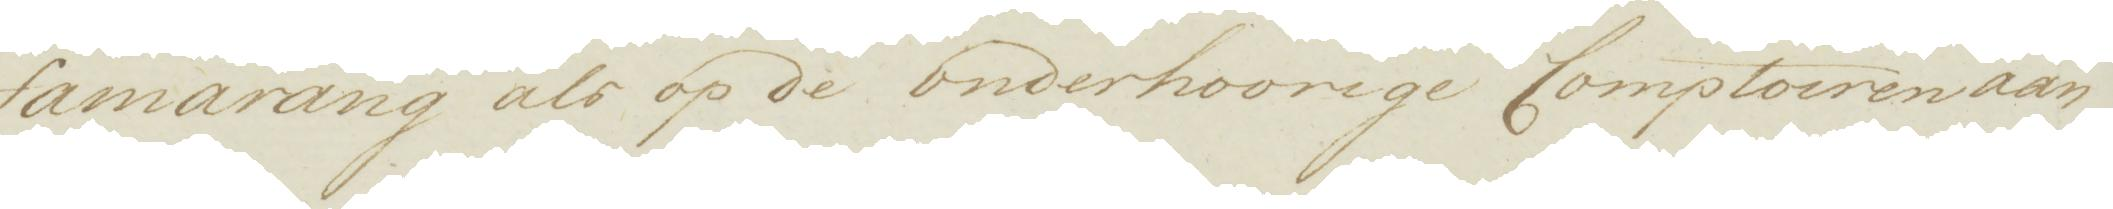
Samarang als op de onderhoorige Comptoiren aan
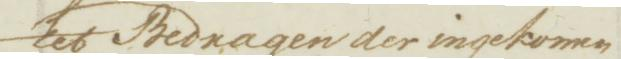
het Bedragen der ingekomen
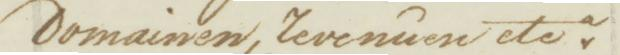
domainen, revenuen etc„a
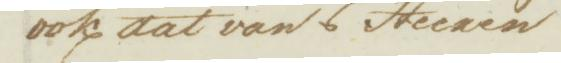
ook dat van s Heeren
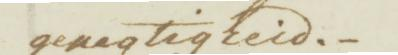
geregtigheid. –
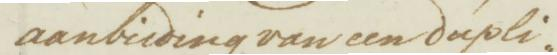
aanbieding van een dupli„
